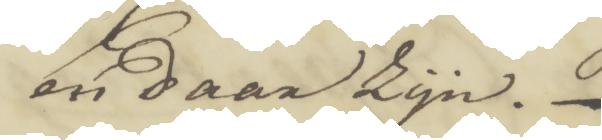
en daar zijn. —
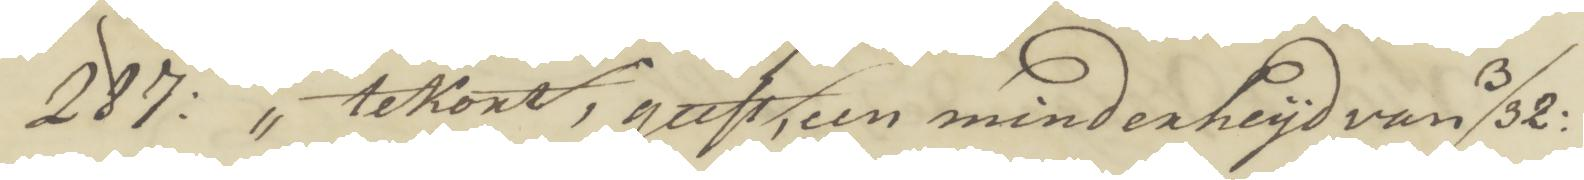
287: „ tekort, geeft, een minderheijd van 3/32:
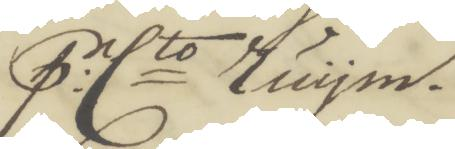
p:r C=to ruijm.
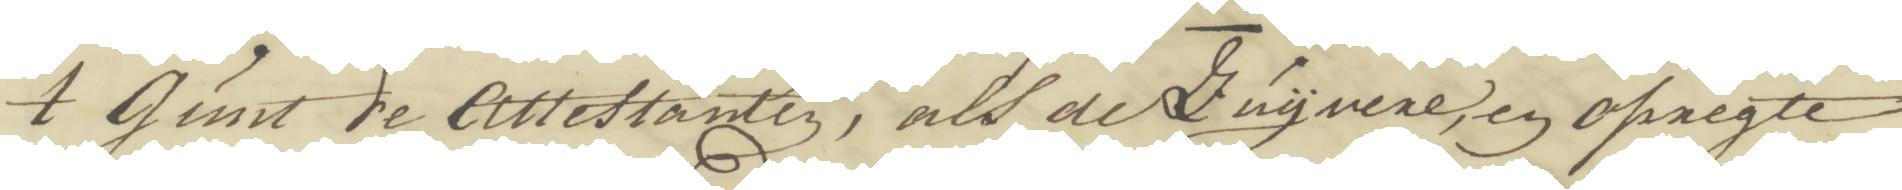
't gunt de Attestanten, als de zuijvere, en opregte
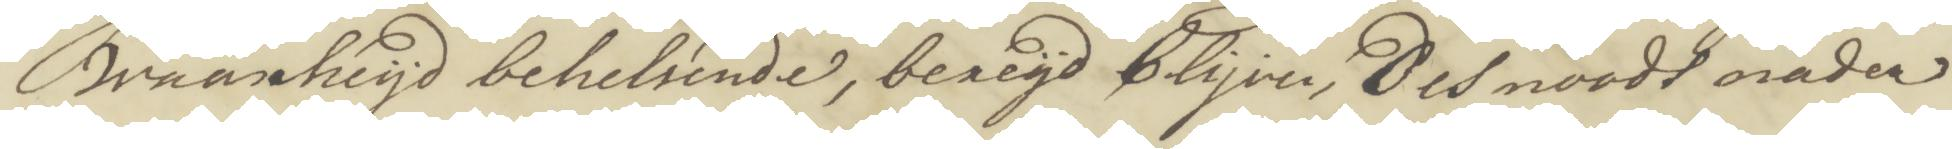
waarheijd behelsende, bereijd blijven, des noods nader
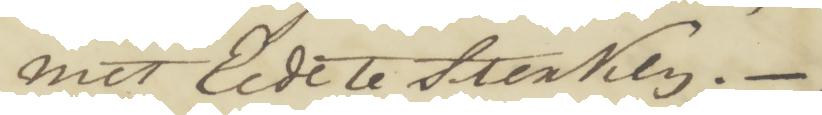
met Eede te sterken.—
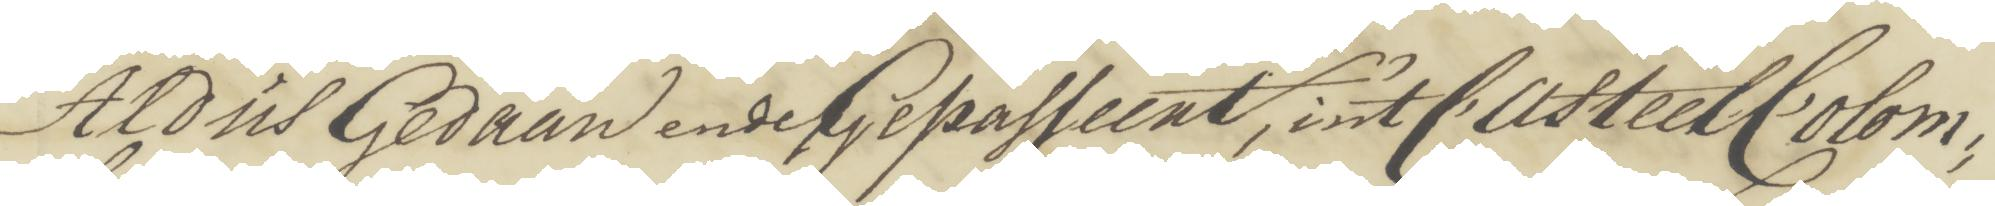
Aldus Gedaan en de Gepasseert, in’t Casteel Colom„
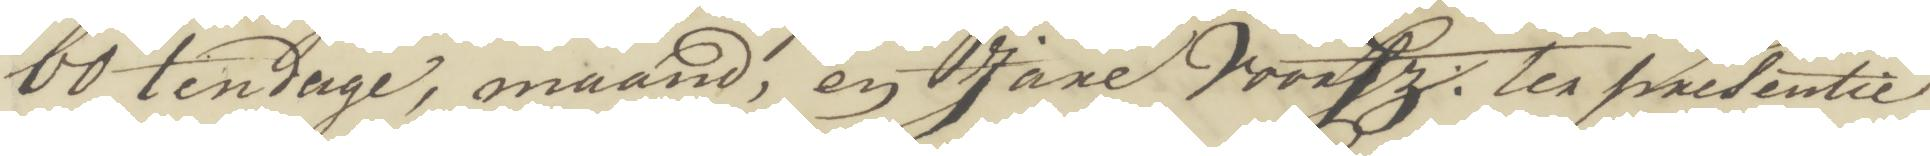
bo ten dage, maand, en Jare voorsz: ter presentie
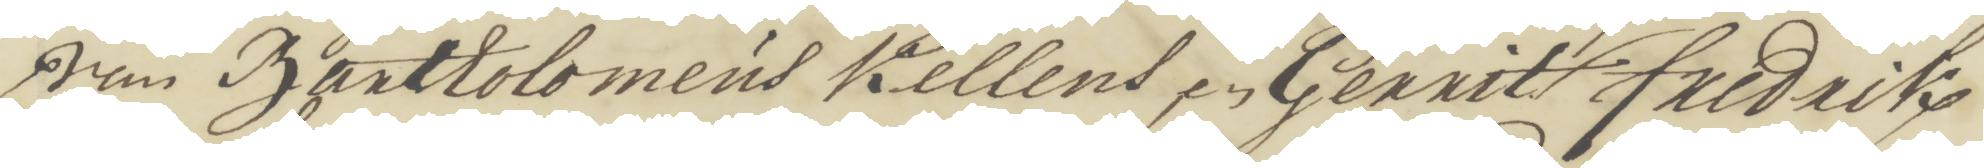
van Bartholomeus Kellens en Gerrits Fredrik
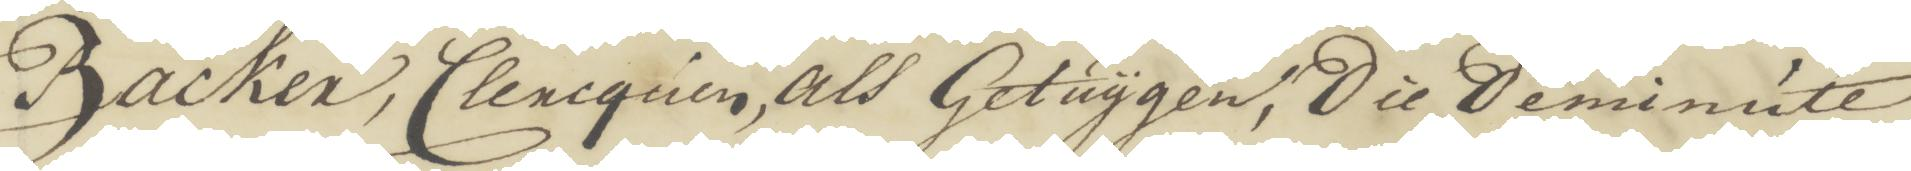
Backer, Clercquen, als Getuijgen, die de minute
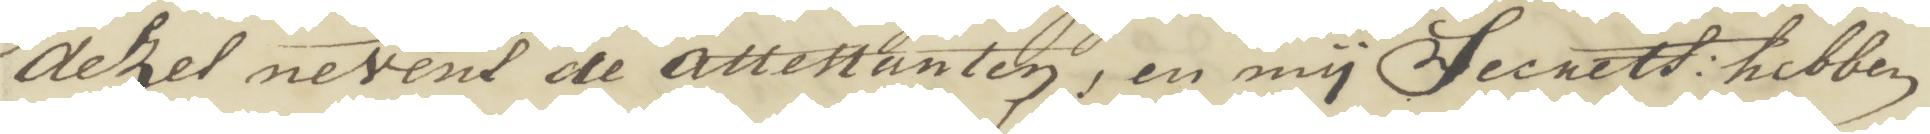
dezes nevens de attestanten, en mij Secrets: hebben
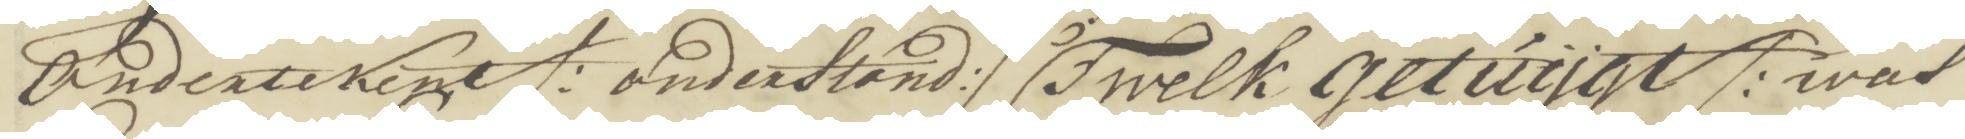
Ondertekent /: onderstond:/ / 'Twelk getuijgt /:was
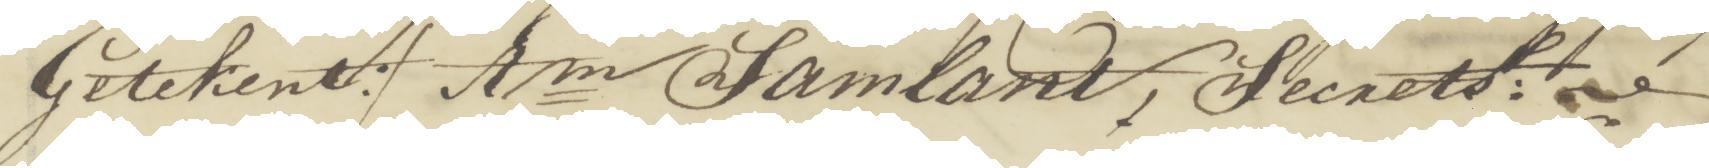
Getekent:/ A=m Samlant, Secrets:
